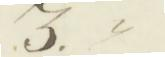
3. „
